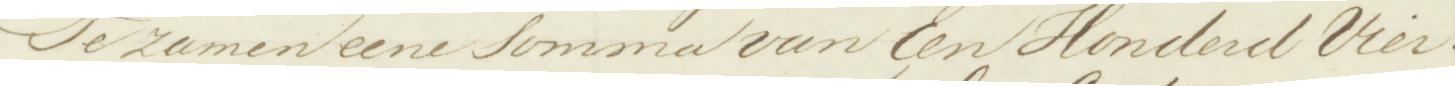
Te zamen eene somma van Een Honderd Vier
